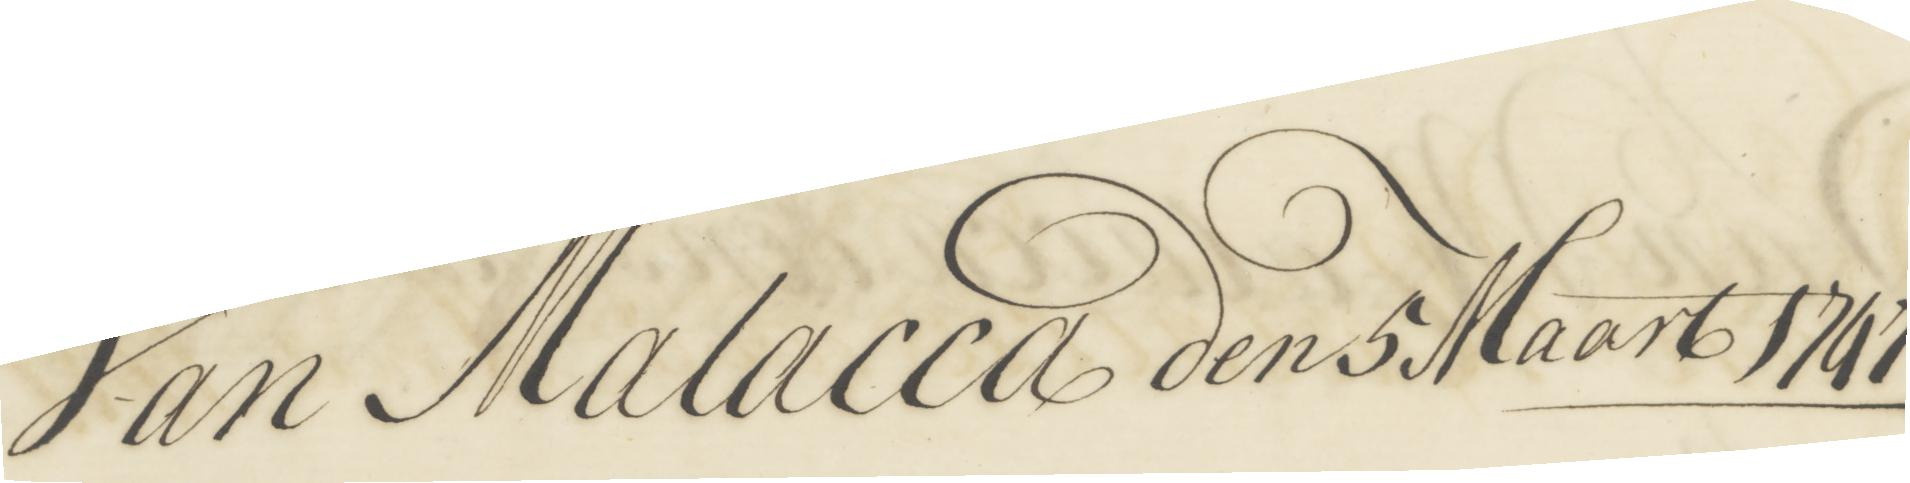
Van Malacca den 5 Maart 1747
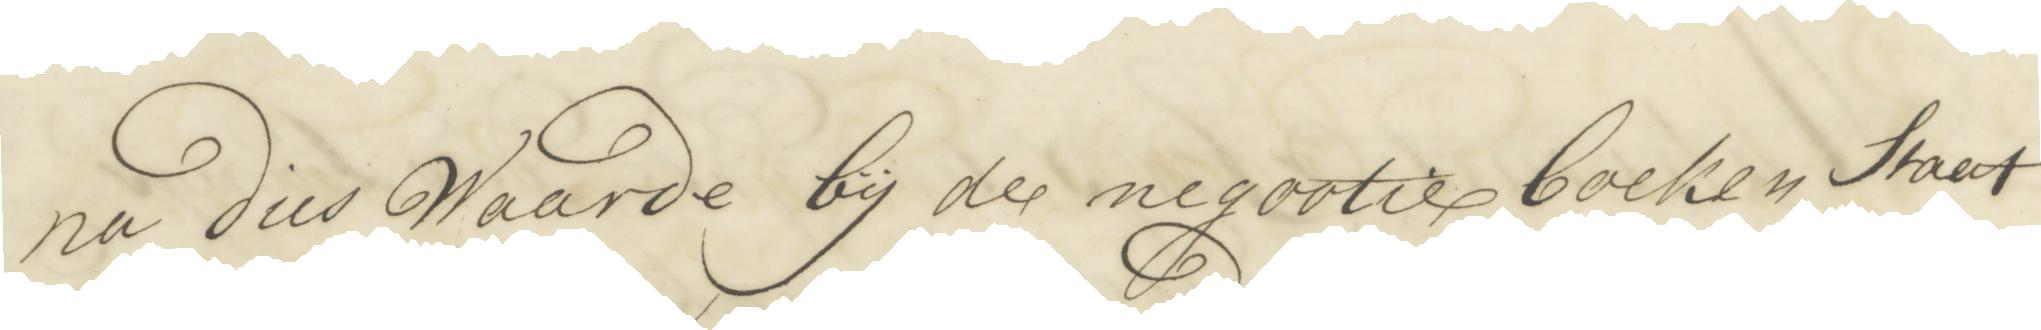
na dies waarde bij de negootie boeken staat
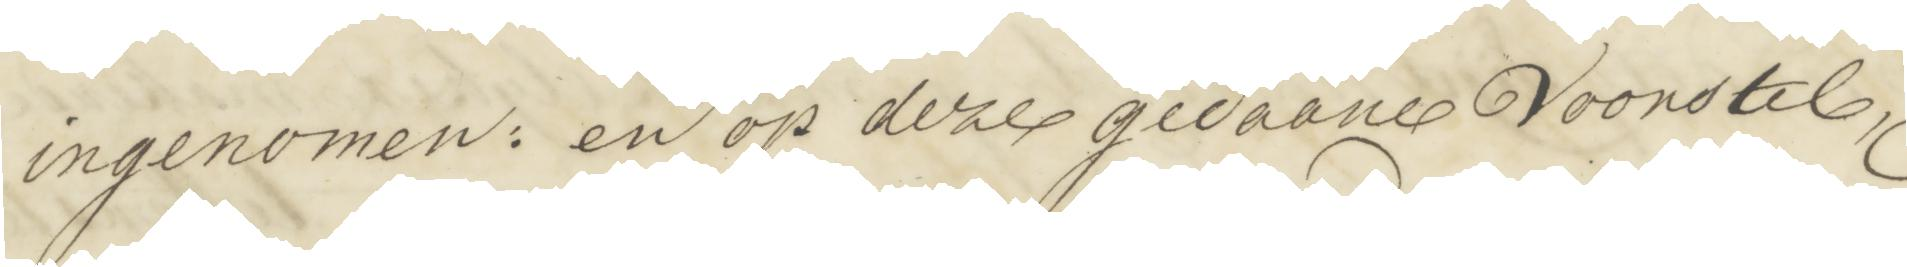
ingenomen: en op deze gedaane voorstel,
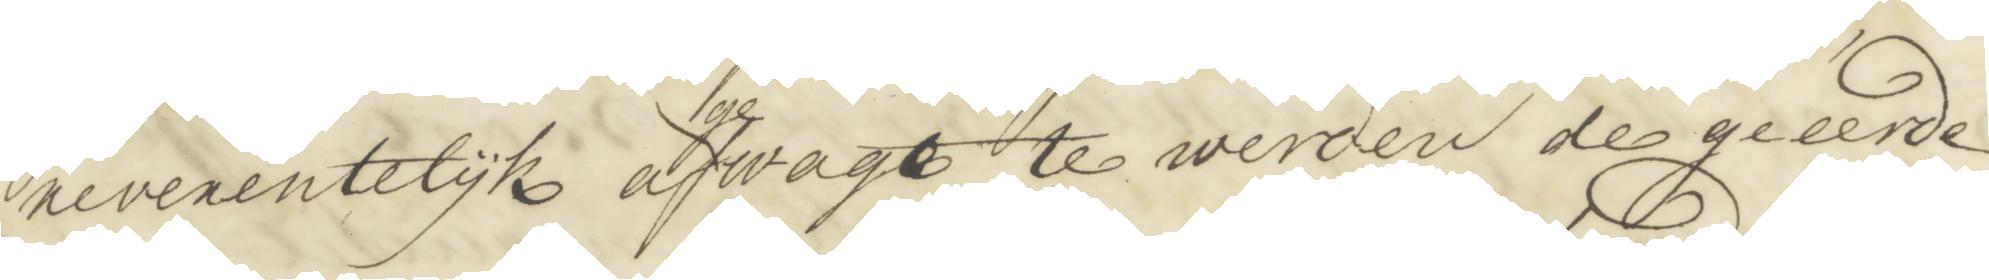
reverentelijk afgewagt te werden de geeerde
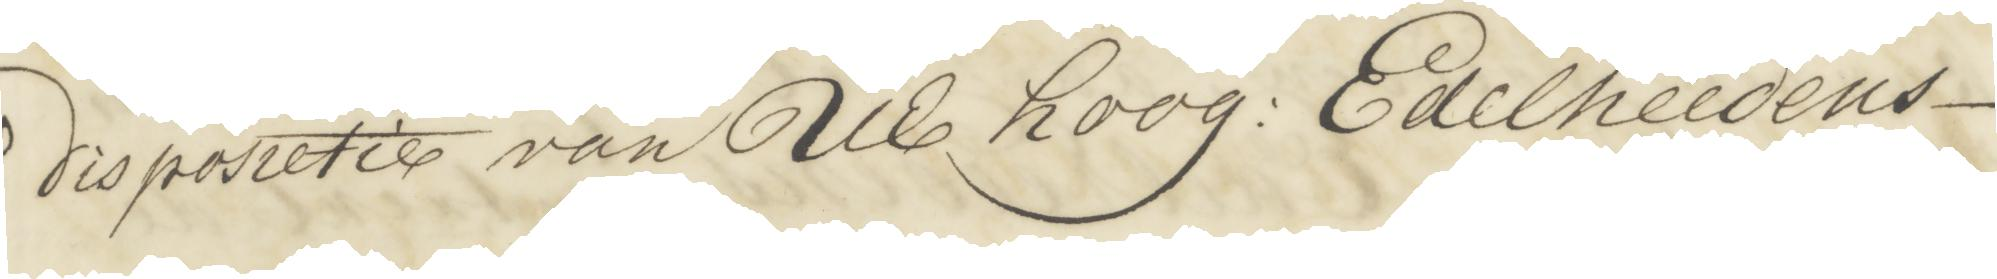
disposietie van UE hoog: Edelheedens
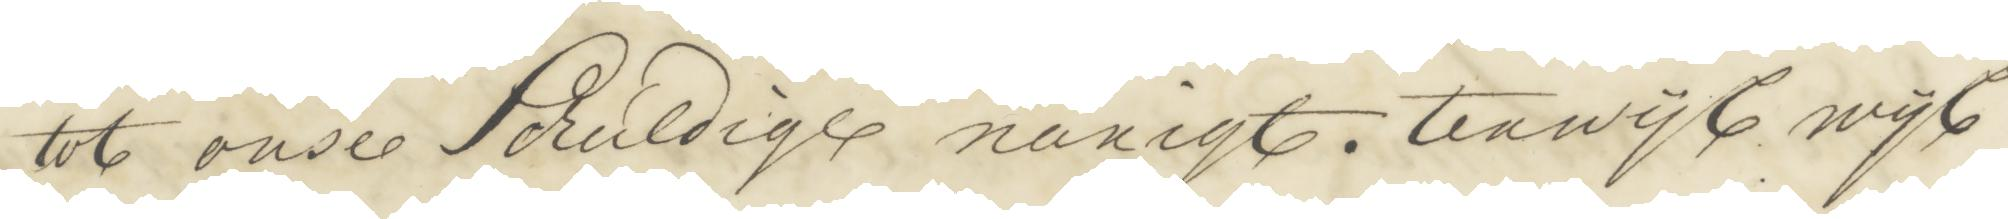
tot onse schuldige narigt. terwijl wijl
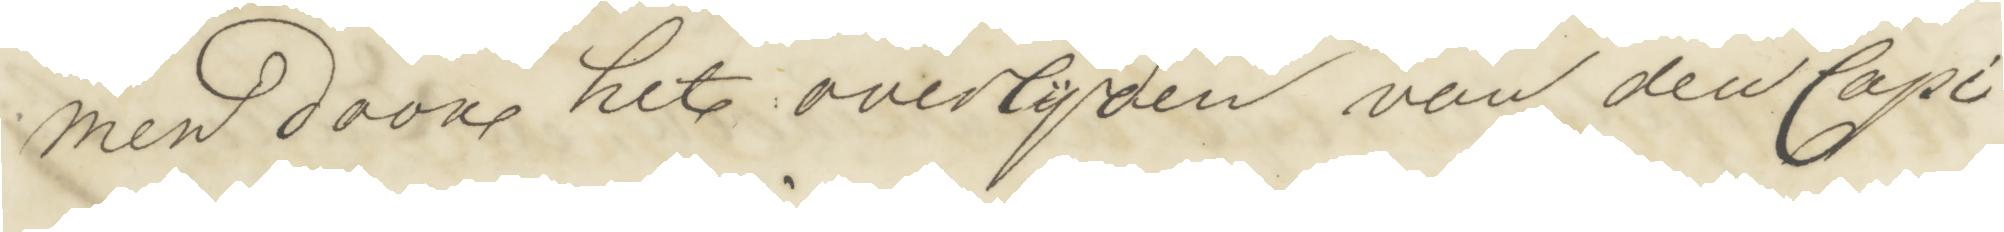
men door het overlijden van den Capi
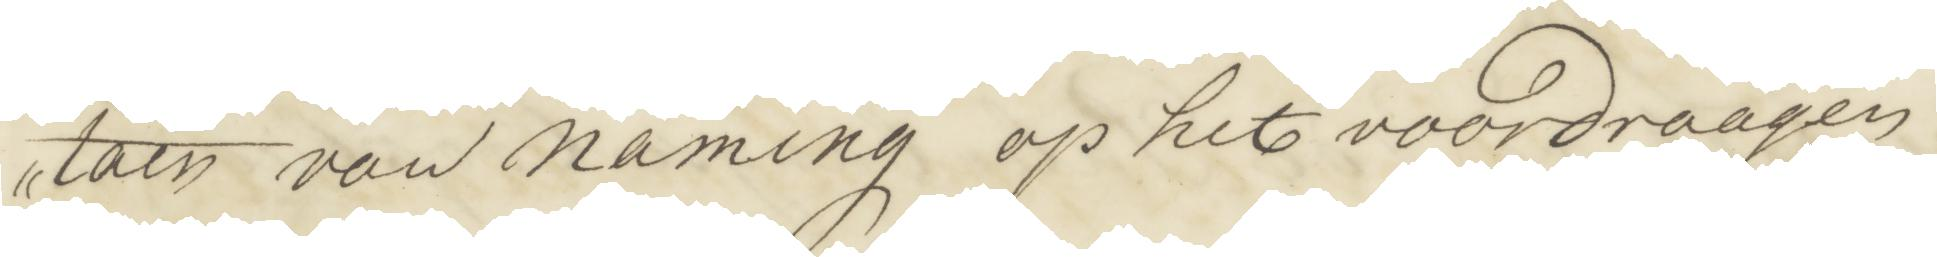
„tain van naming op het voordraagen
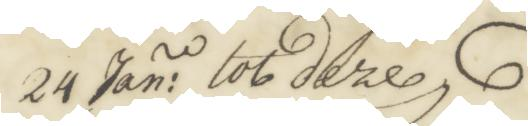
24 Jan: tot deze
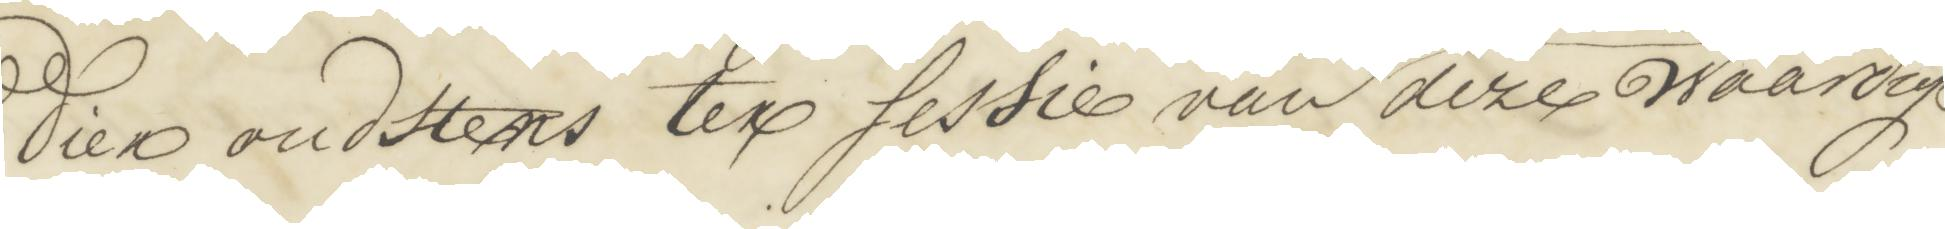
dier oudstens ter sessie van deze waardig
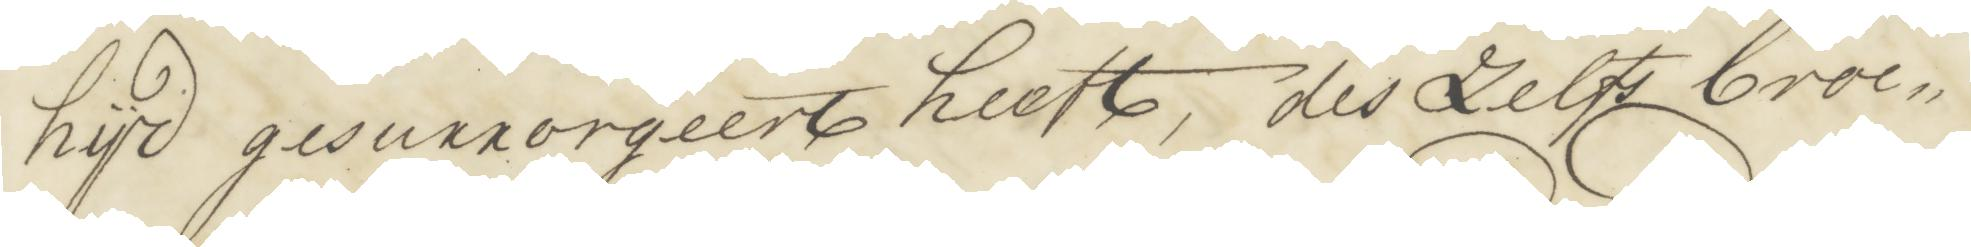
hijd gesurrorgeert heeft, des zelfs broe„
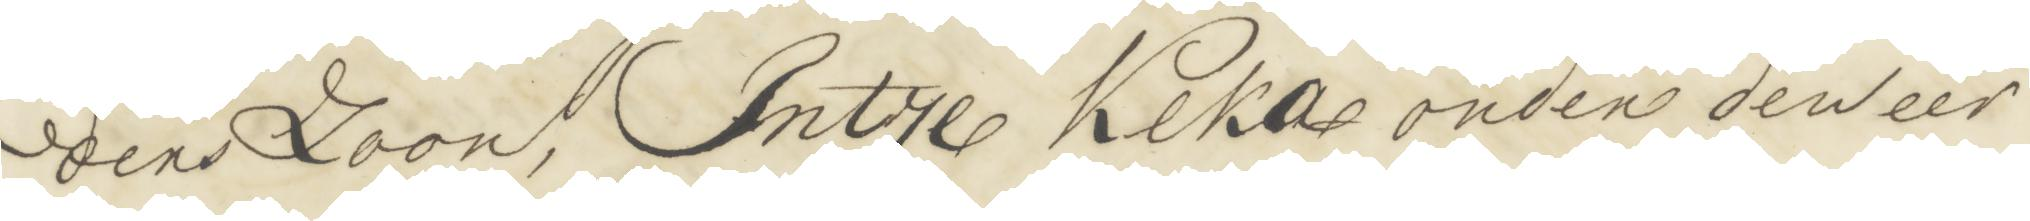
ders zoon, Intje Keka onder den eer
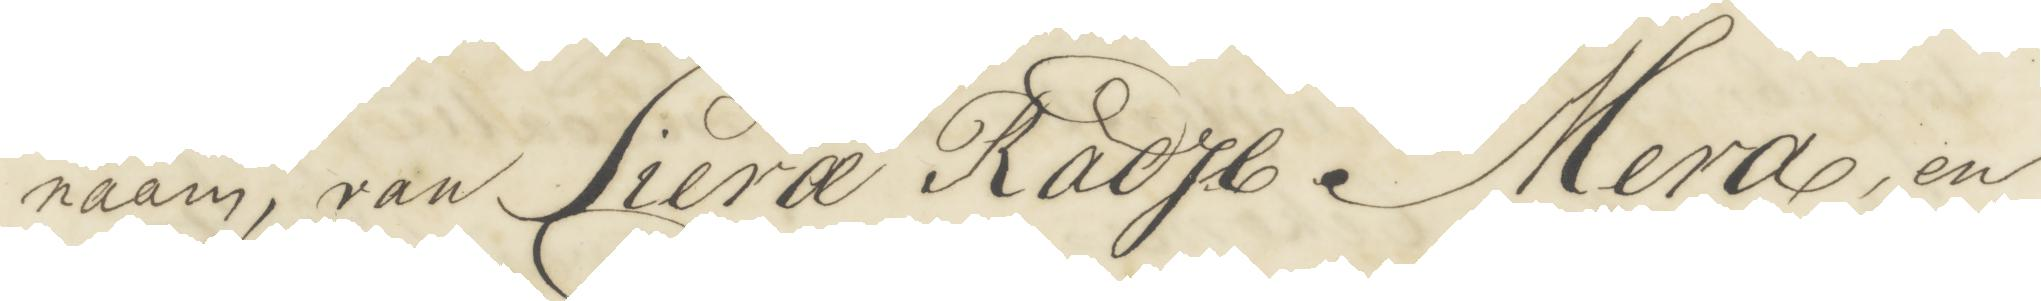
naam, van Siera Radje Mera, en
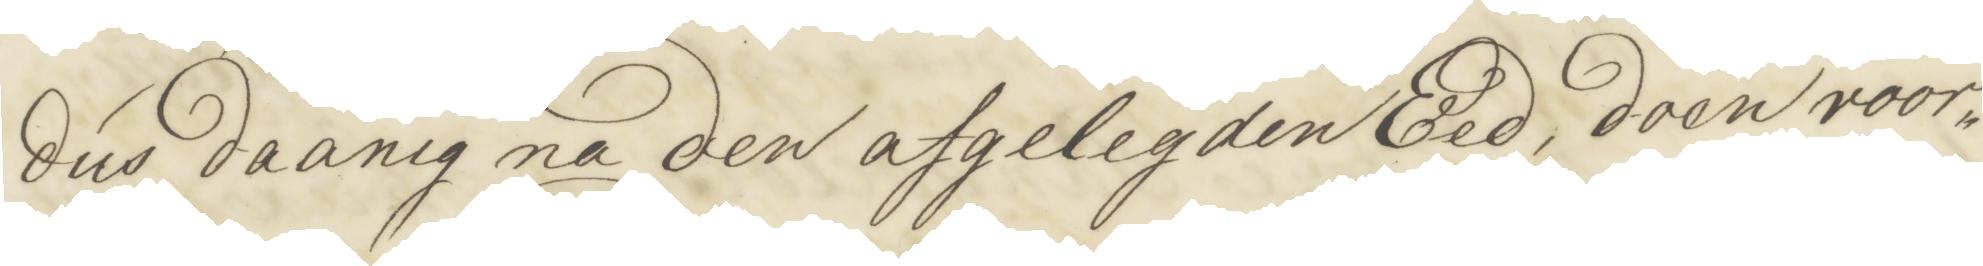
dus daanig na den afgelegden Eed, doen voor
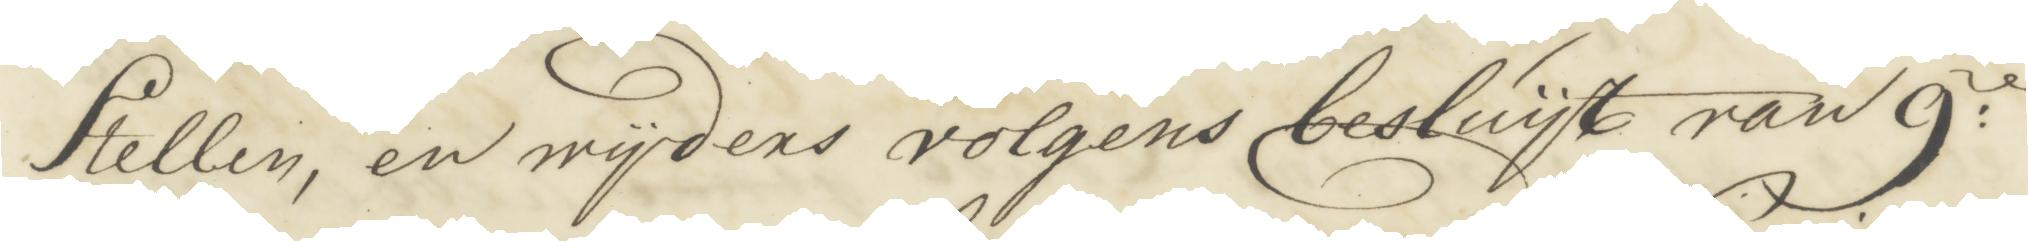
stellen, en wijders volgens besluijt van 9:e
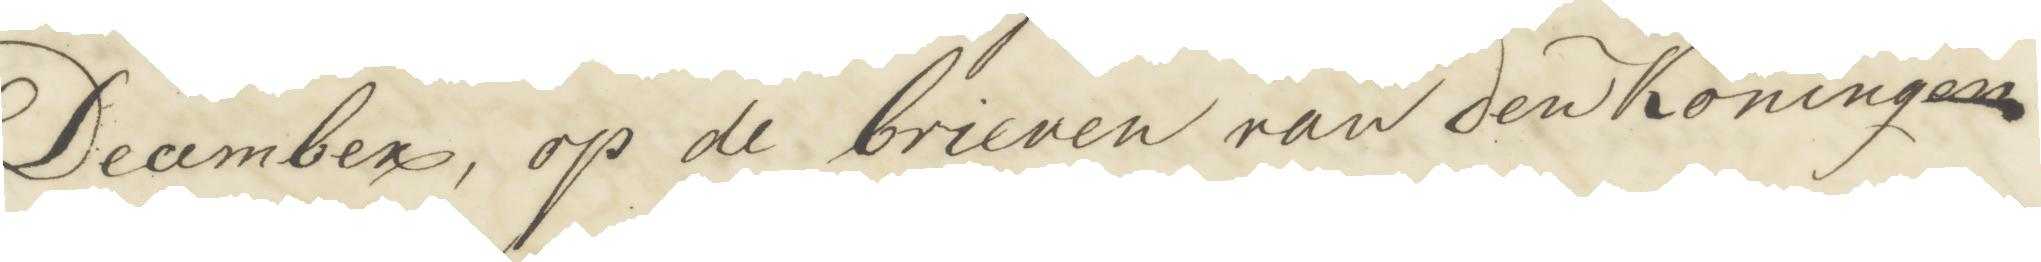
December, op de brieven van den Koningen
